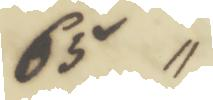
65 „
